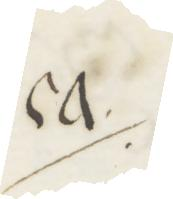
54:
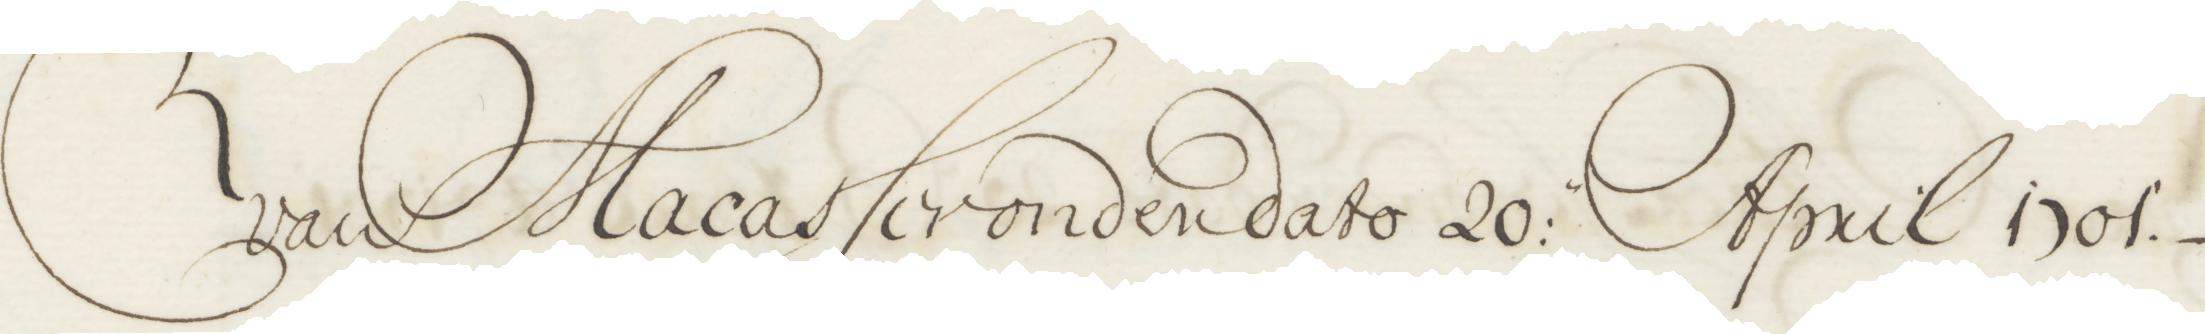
Van Macasser onder dato 20:e April 1701.
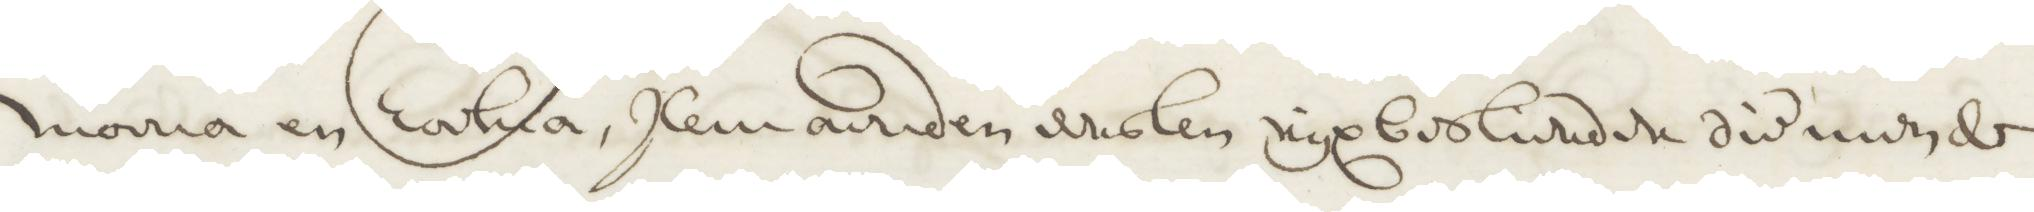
mouna en roekia, Jtem aenden eersten rijx bestierder die men de
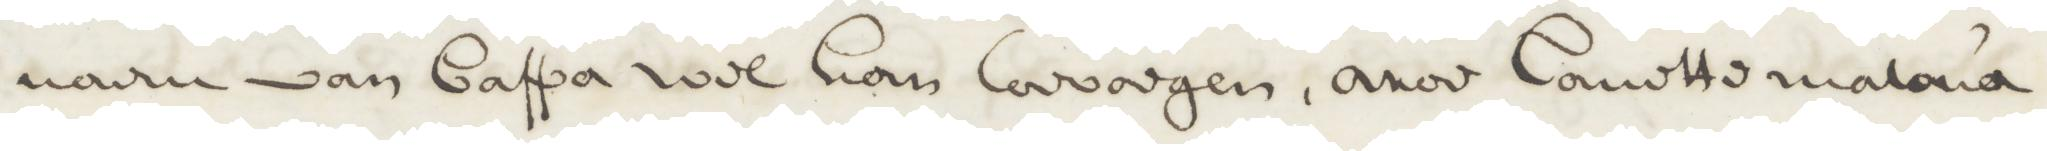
naem van bappa wel kan toevoegen, aroe Tanette matoua
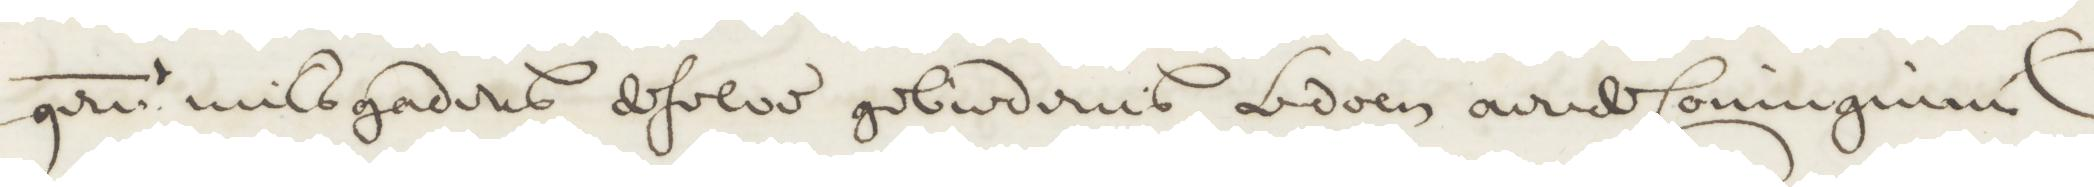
gen:t mits gaders deselve gebiedenis te doen aende Coninginne
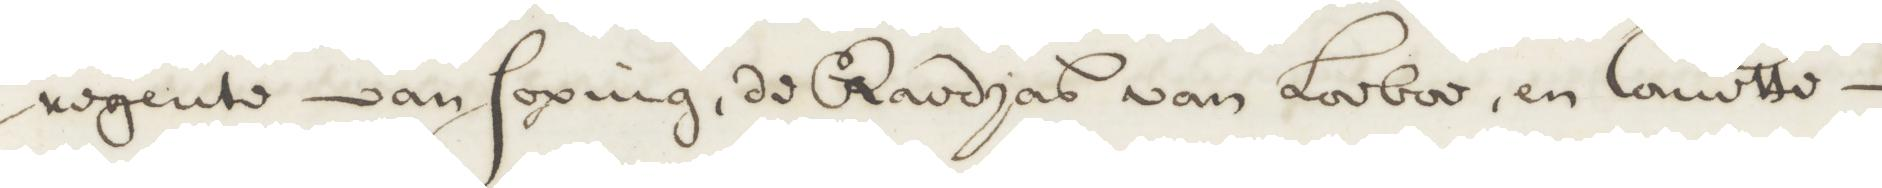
regente van Soping, de Raedjas van Loeboe, en Tanette
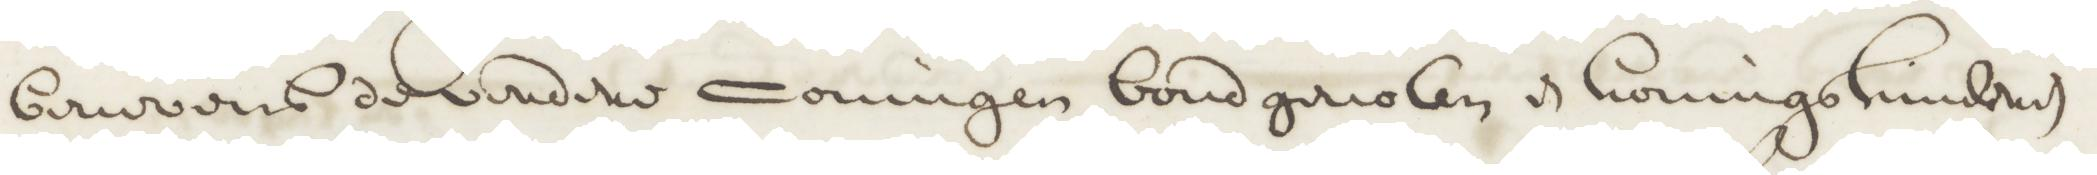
benevens de verdere Coningen bondgenoten en koningskinderen
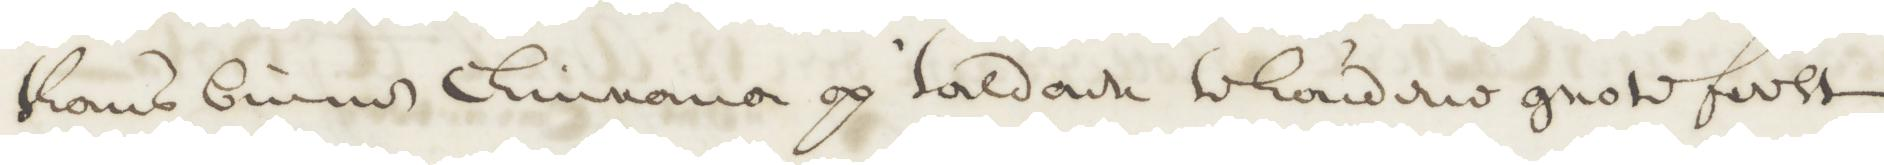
thans binnen Chinrana op 't aldaer te houdene grote feest
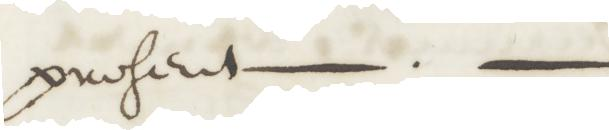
present—.—
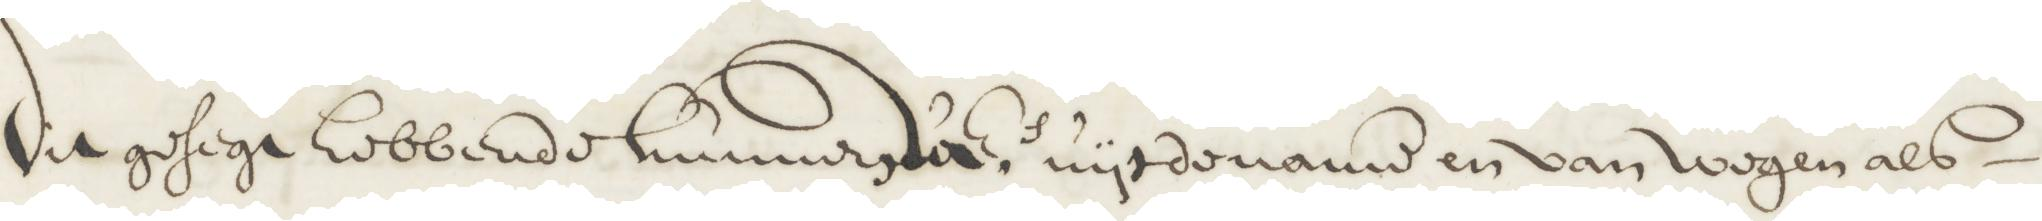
Dit gesegt hebbende kunnen U E:s, uijt de name en van wegen als
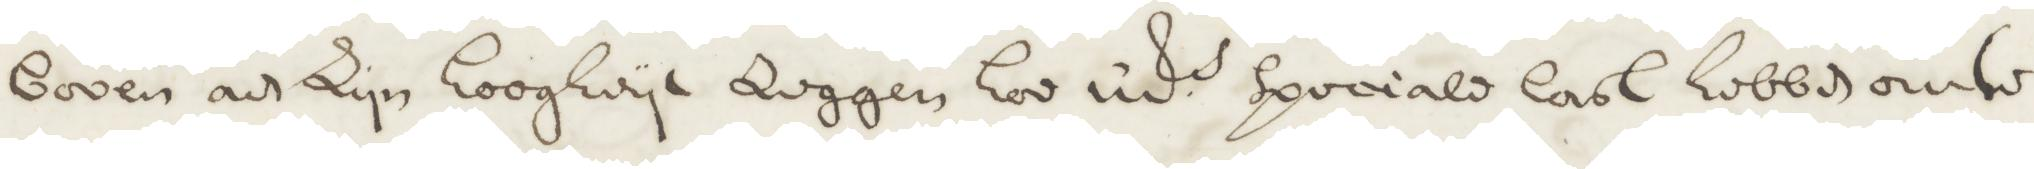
boven aen Zijn hoogheijt Zeggen hoe uE:s speciale last hebben om te
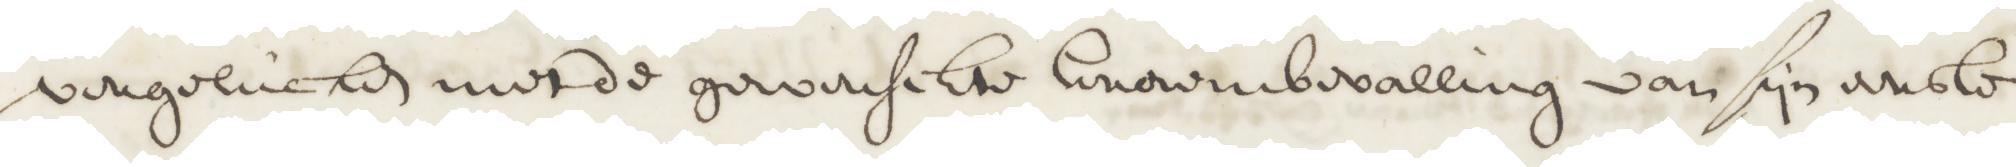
vergelucken met de gewenschte kraembevalling van sijn eerste
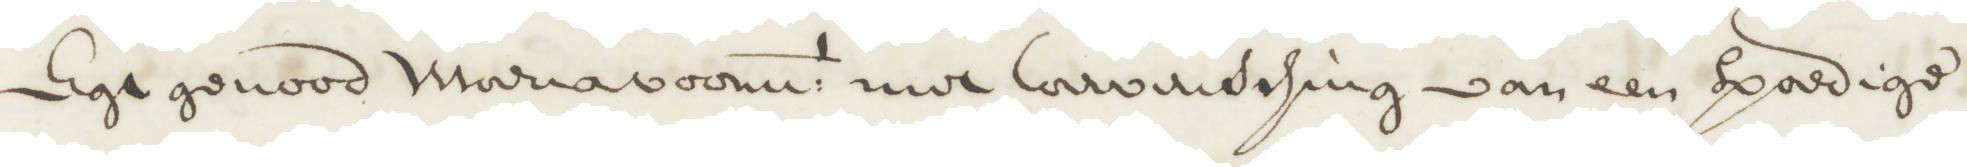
Egt genood Moena voorn:t met toewensching van een spoedige
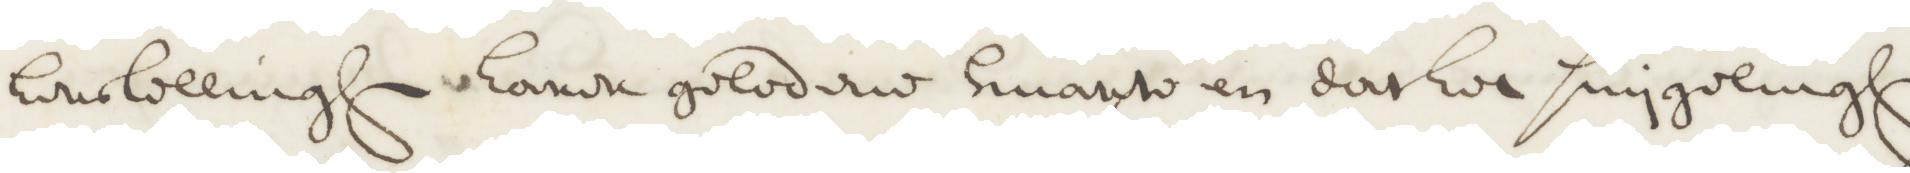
herstellingh harer geledene smarte en dat het Suijgelingh
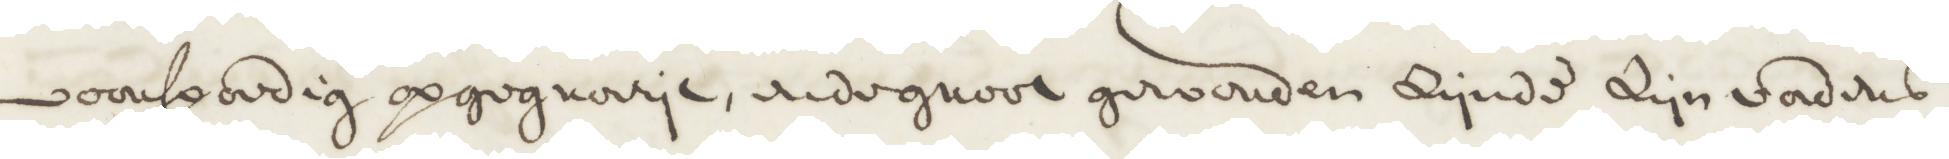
voorspoedig opgegroeijt, ende groot geworden Zijnde Zijn vaders
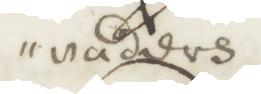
„vaders
